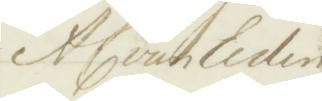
AC van Eeden
